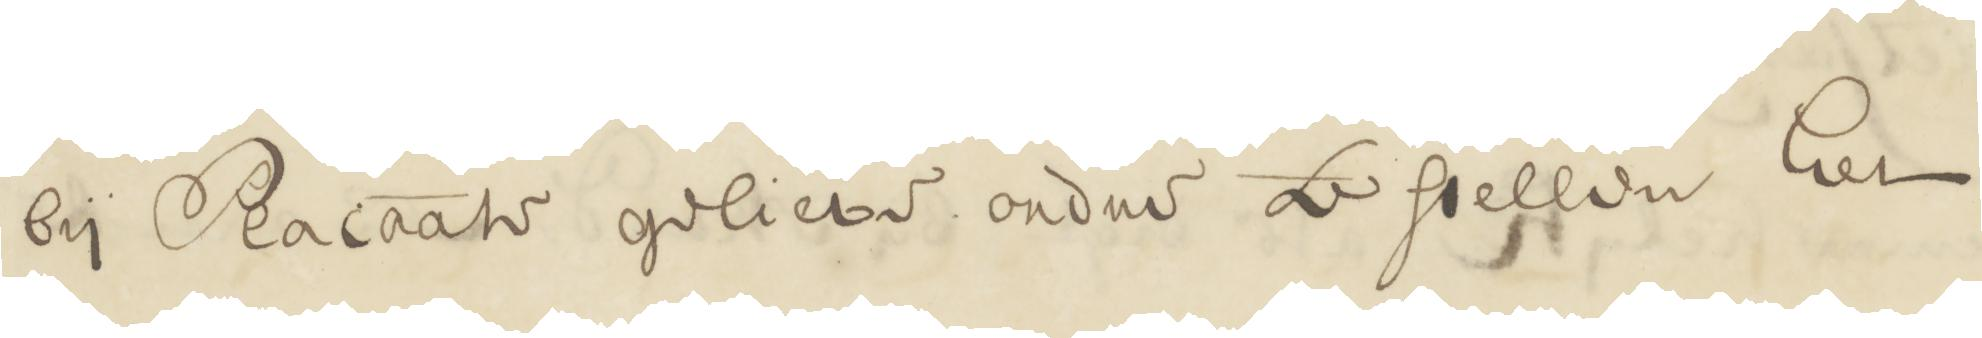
bij Placaate gelieve ordre te stellen het
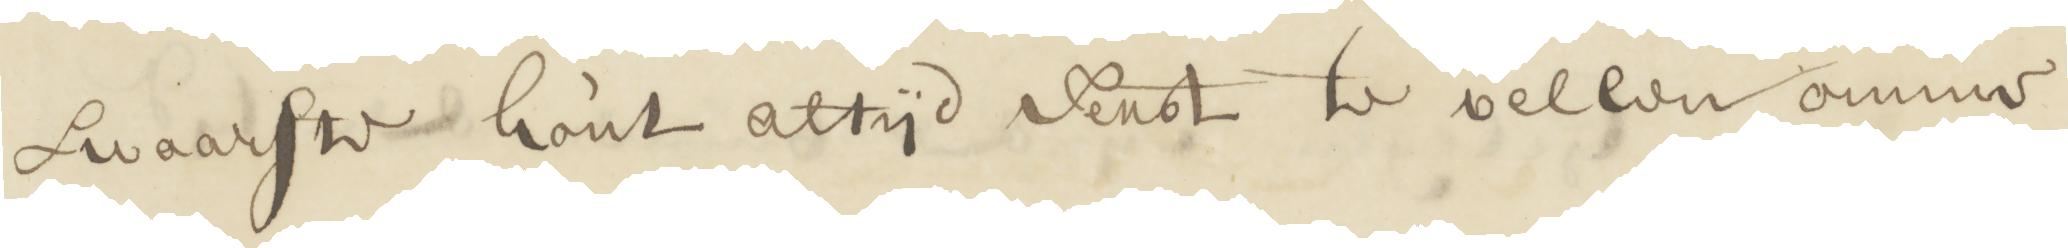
swaarste hout altijd eerst te vellen omme
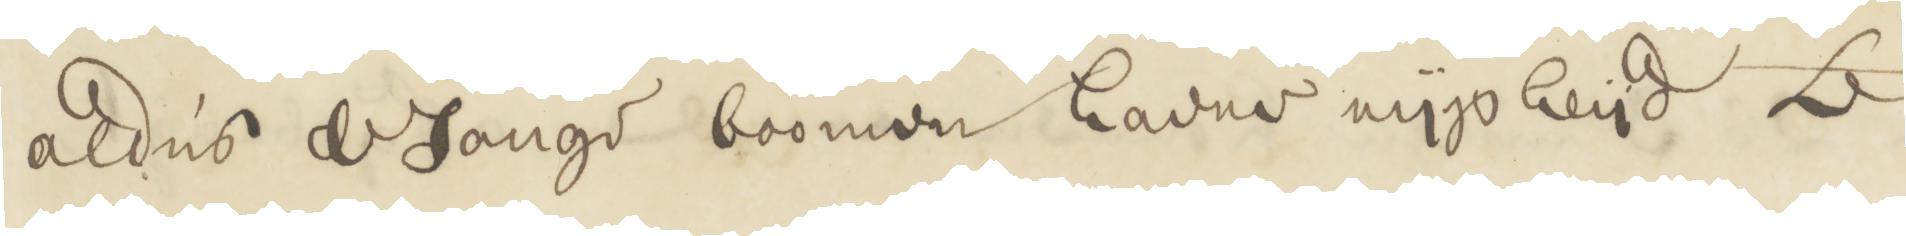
aldus de jonge boomen haere rijpheijd te
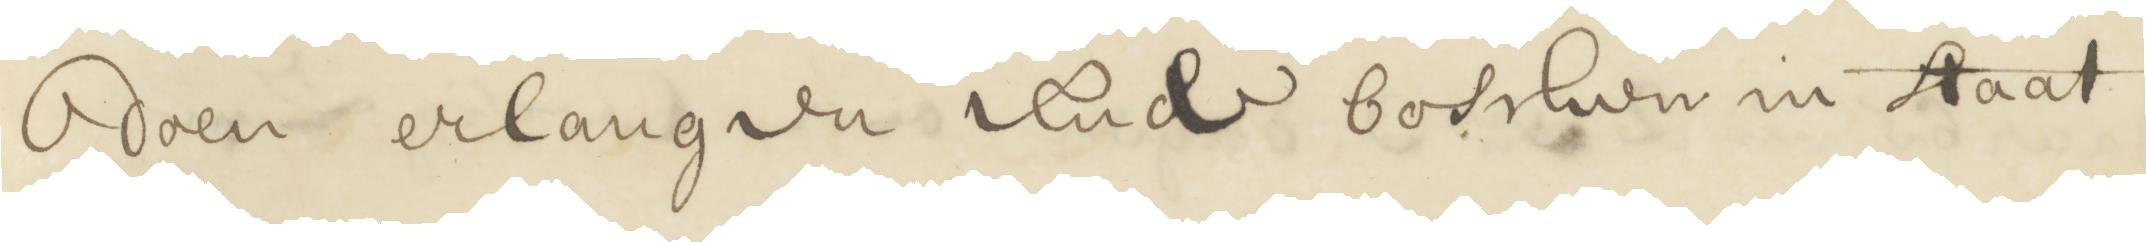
doen erlangen En de boschen in staat
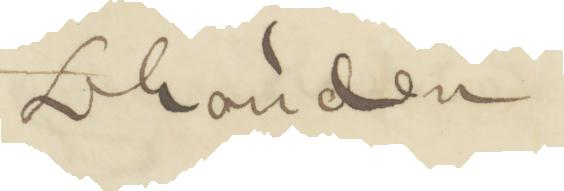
te houden
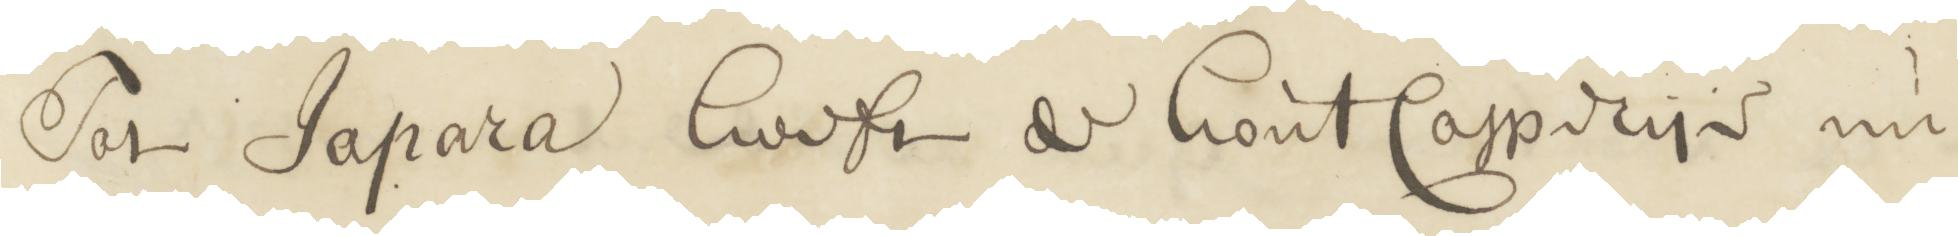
Tot Japara heeft de hout capperije nu
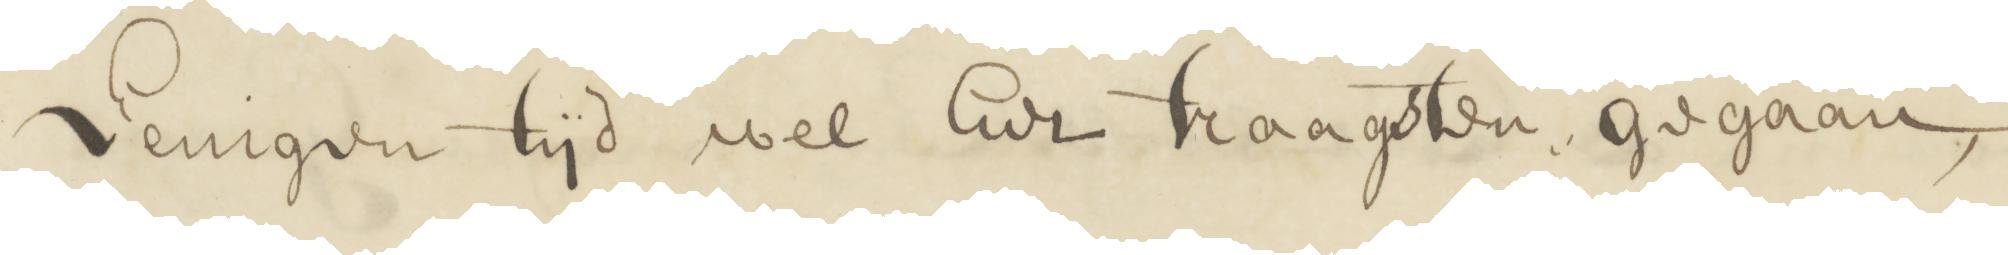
eenigen tijd wel het traagsten gegaan,
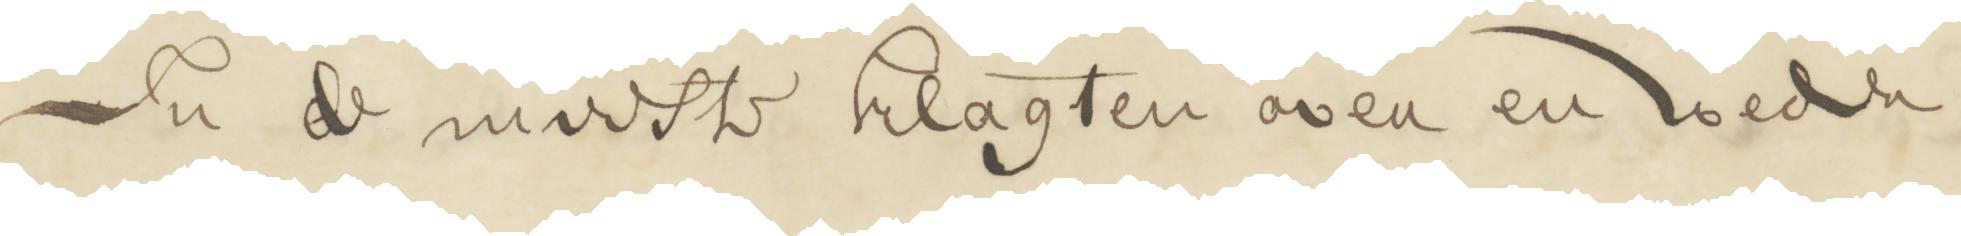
en de meeste klagten over en weder
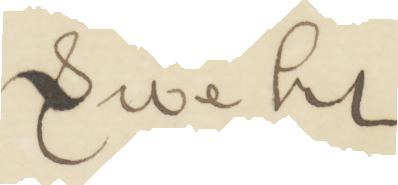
verwekt
